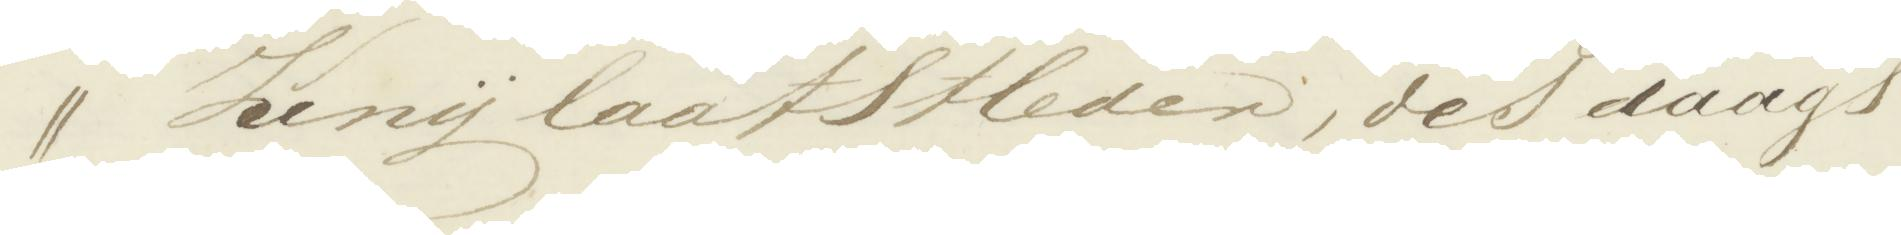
„ Iunij laatstleden, des daags
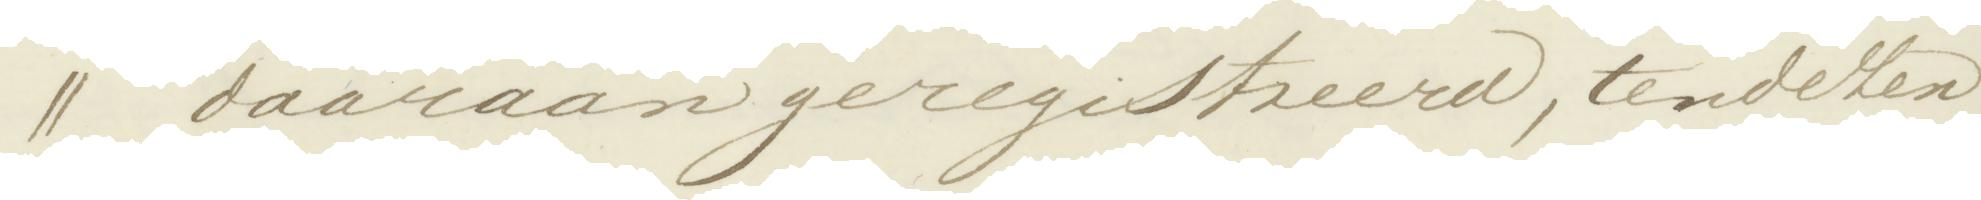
„ daaraan geregistreerd, ten dezen
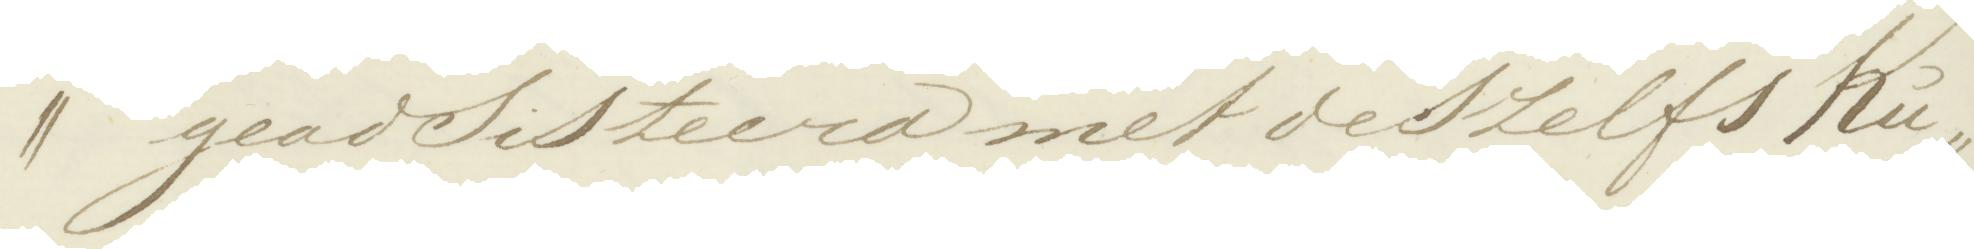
„ geadsisteerd met deszelfs Ku„
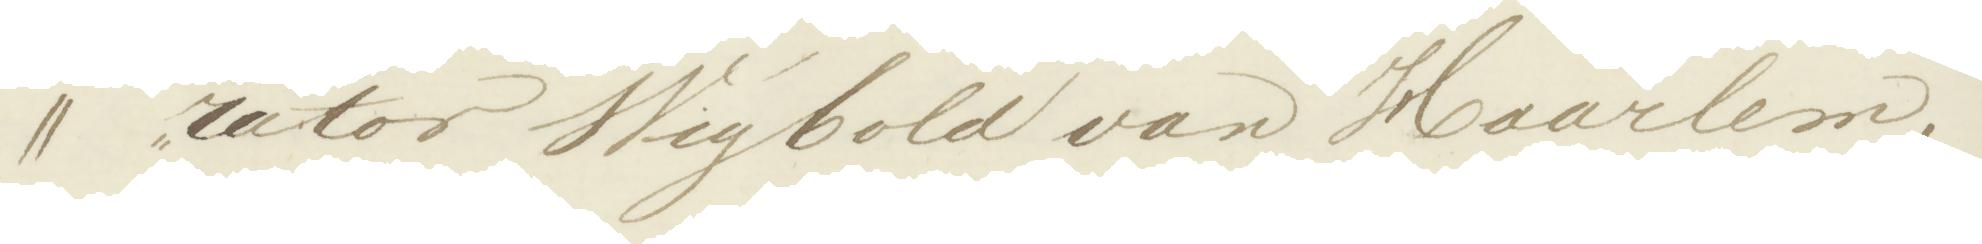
„ „rator Wigbold van Haarlem,
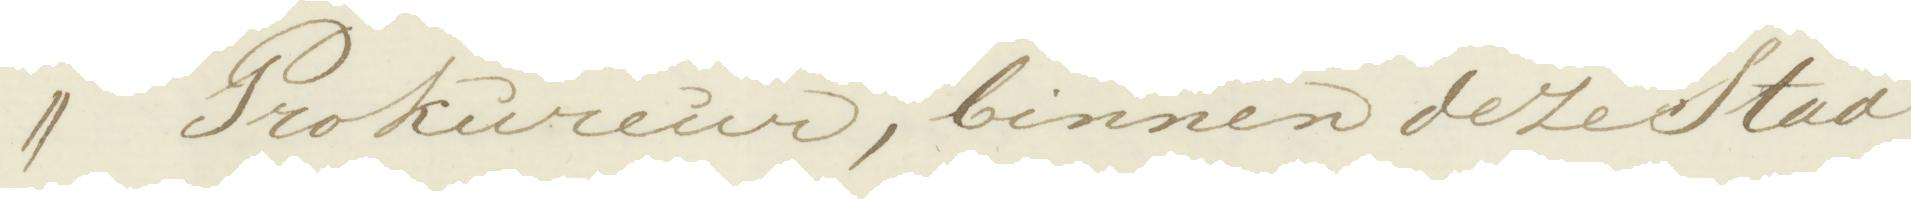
„ Prokureur, binnen deze stad
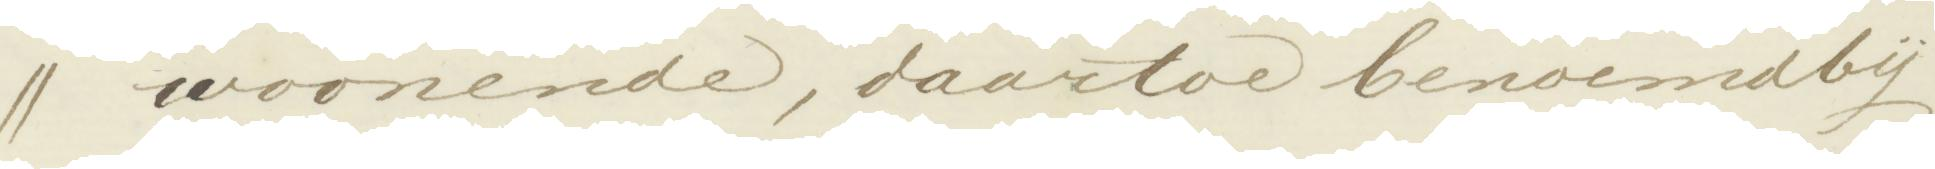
„ woonende, daartoe benoemdbij
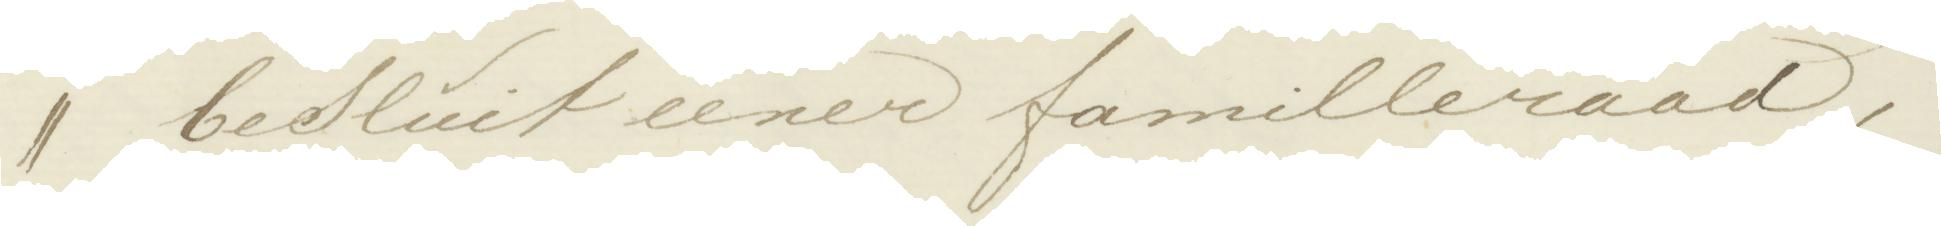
„ besluit eener familleraad
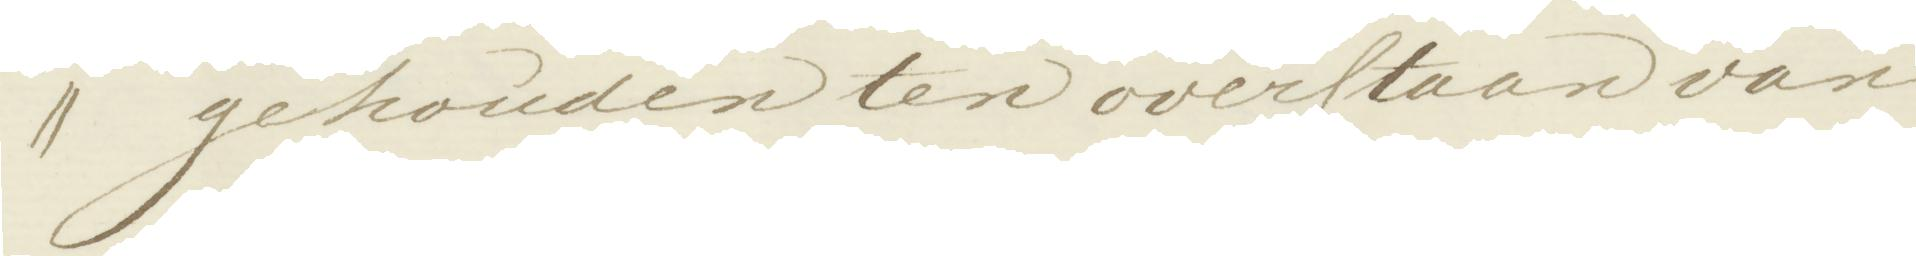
„ gehouden ten overstaan van
